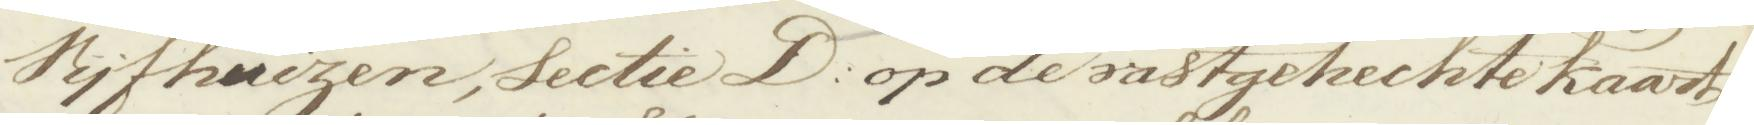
Vijfhuizen, sectie D: op de vastgehechte kaart
